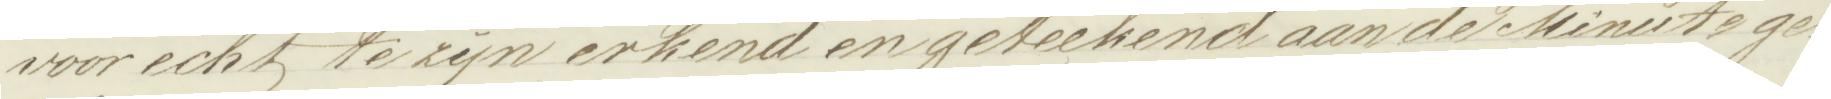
voor echt te zijn erkend en geteekend aan de Minute ge
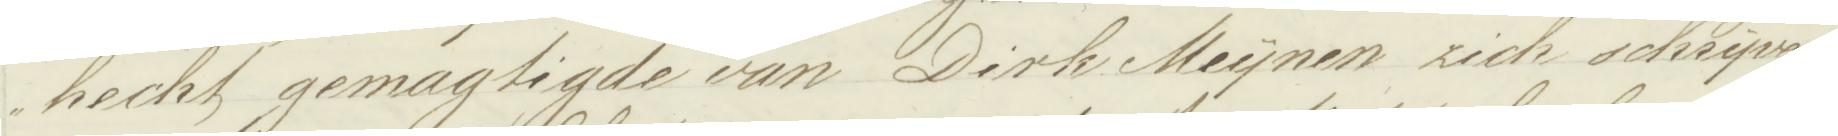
=hecht gemagtigde van Dirk Meijnen zich schrijven.
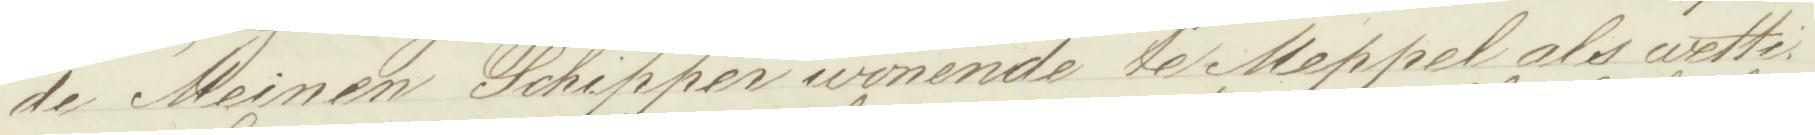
de Meinen Schipper wonende te Meppel als wetti.
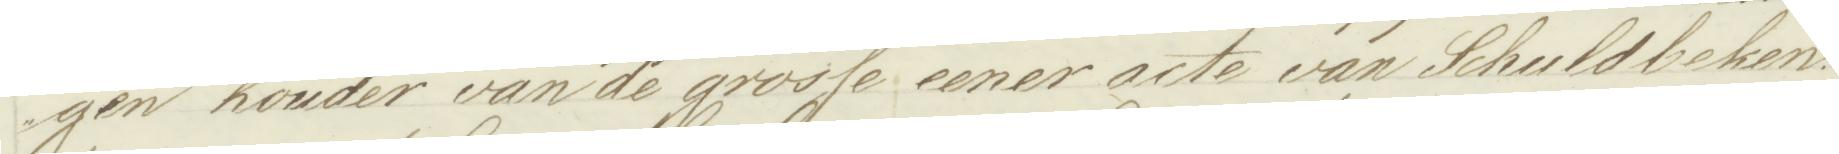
„gen houder van de grosse eener acte van Schuldbeken.
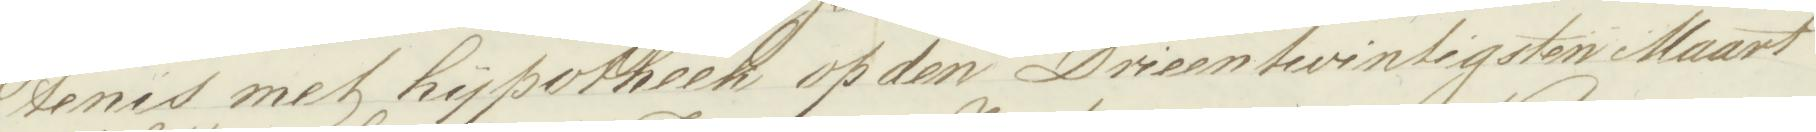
tenis met hijpotheek op den Drieen twintigsten Maart
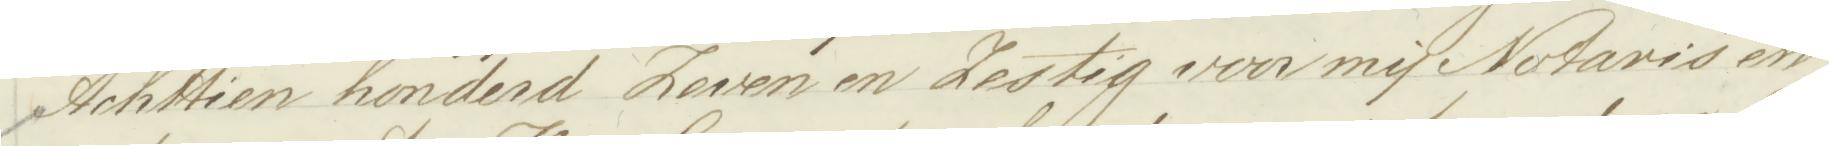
Achttien honderd Zeven en Zestig voor mij Notaris en
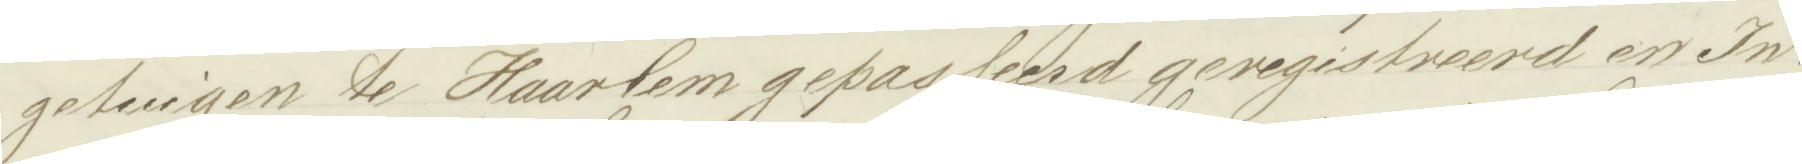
getuigen te Haarlem gepasseerd geregistreerd en In
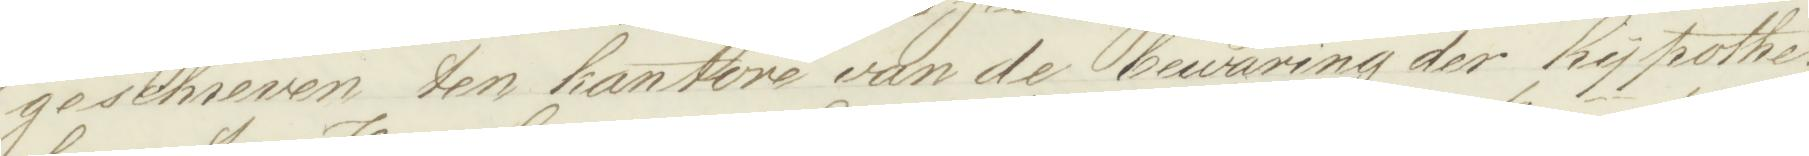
geschreven ten kantore van de bewaring der hijpothe.
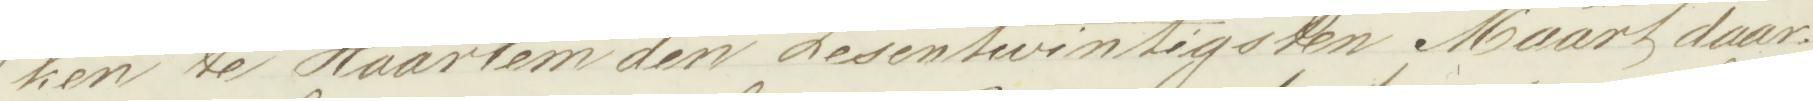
ken te Haarlem den Zesentwintigsten Maart daar.
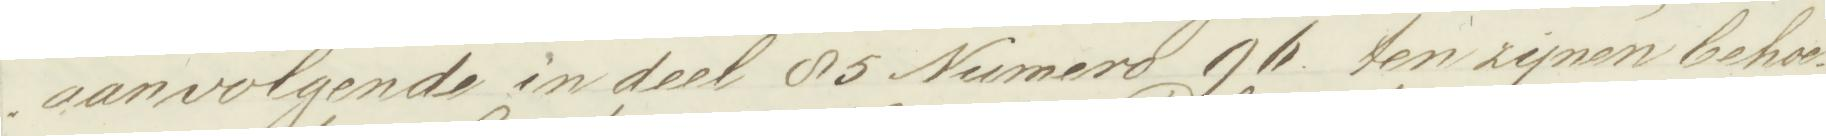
„aan volgende in deel 85 Numero 96. ten zijnen behoe„
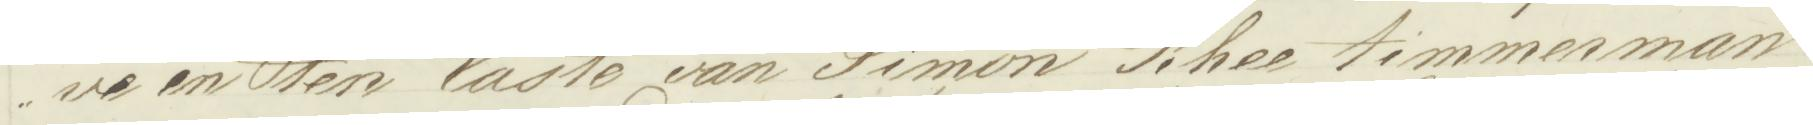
„ve en ten laste van Simon Rhee timmerman
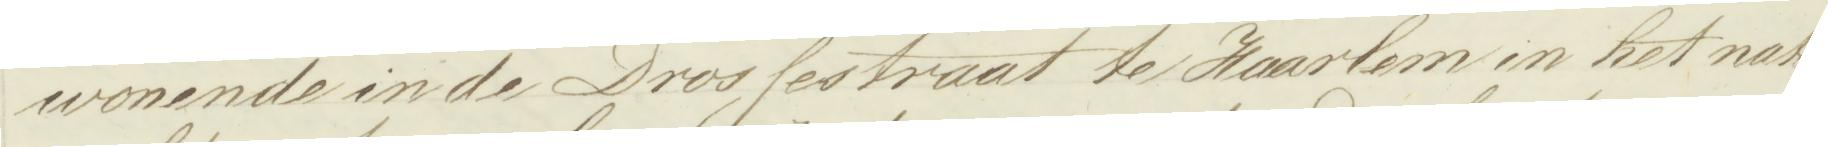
wonende in de Drossestraat te Haarlem in het nate
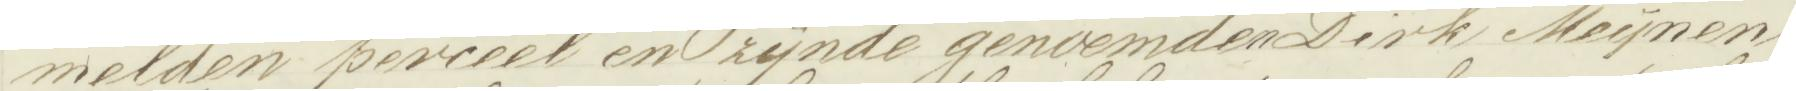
melden perceel en zijnde genoemden Dirk Meijnen
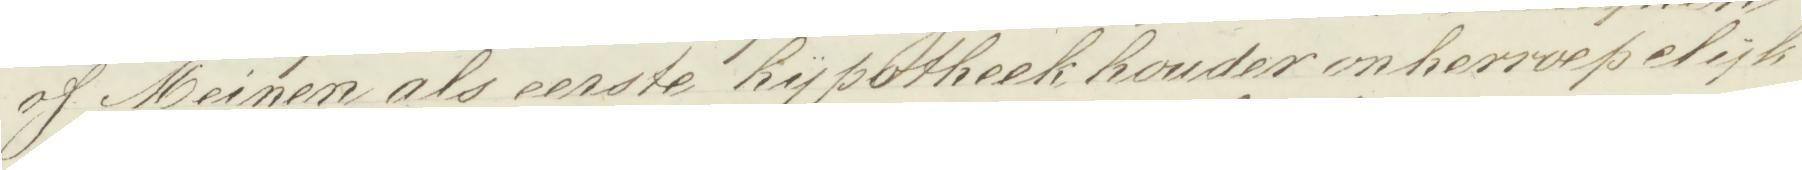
of Meinen als eerste hijpotheek houder onherroepelijk
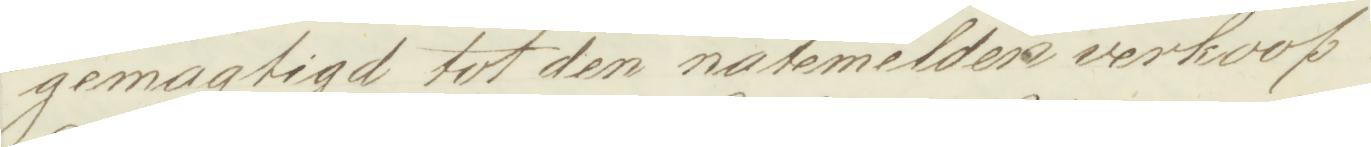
gemagtigd tot den natemelden verkoop
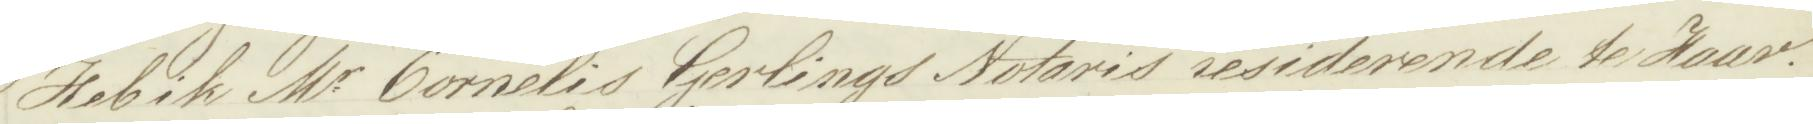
Heb ik M.r Cornelis Gerlings Notaris residerende te Haar.
